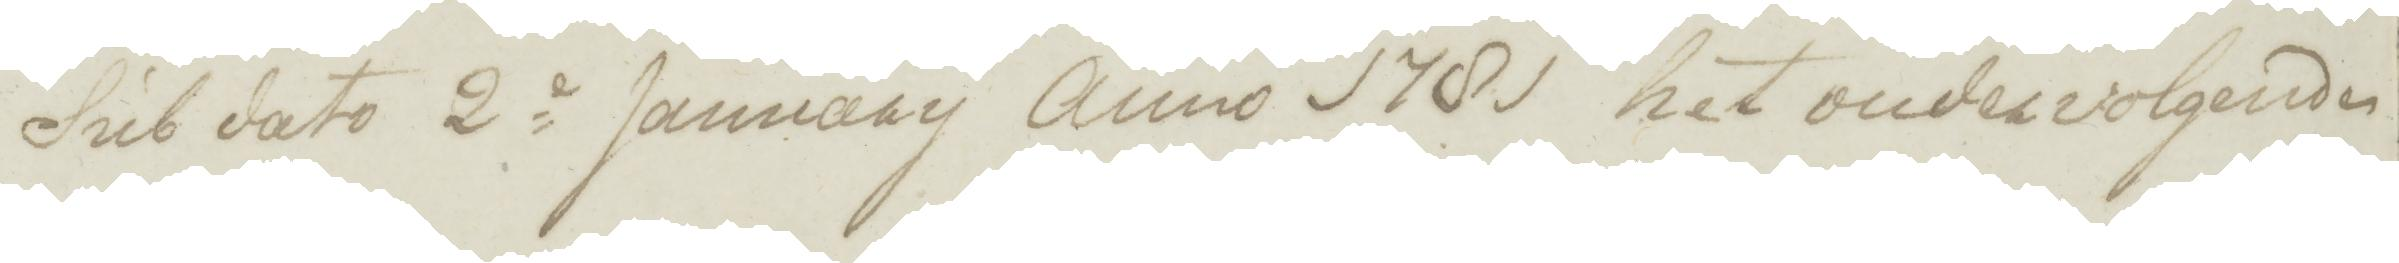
sub dato 2=e Januarij Anno 1781 het ondervolgenden
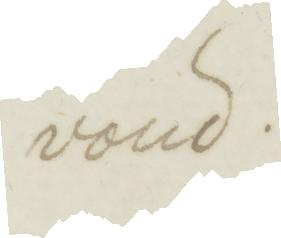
vond
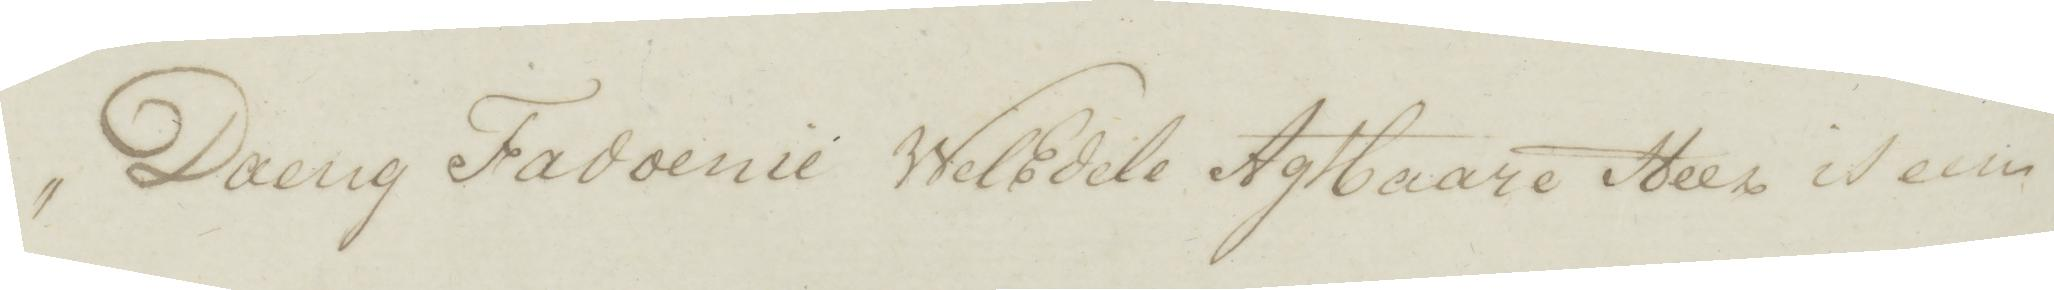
„ Daeng Fadoenie WelEdele Agtbaare Heer is een
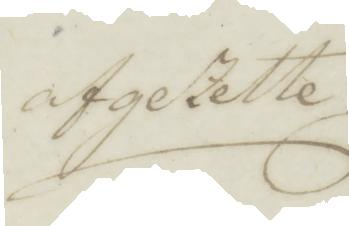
afgezette
